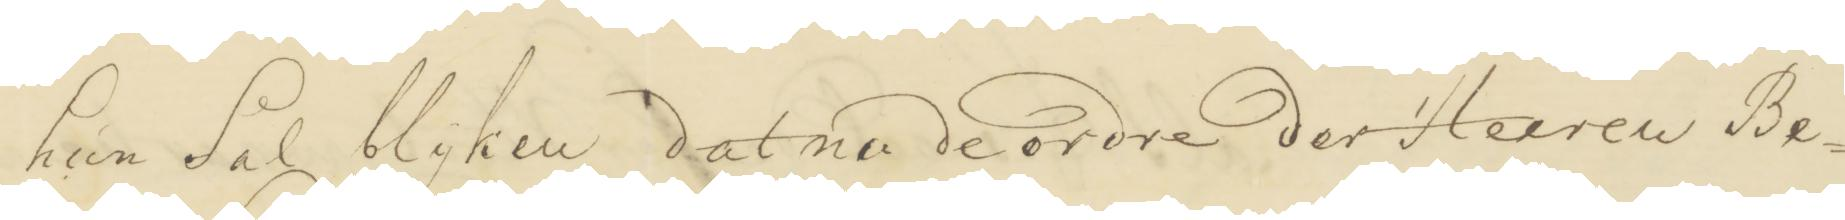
hun sal blijken dat na de ordre der Heeren Be=
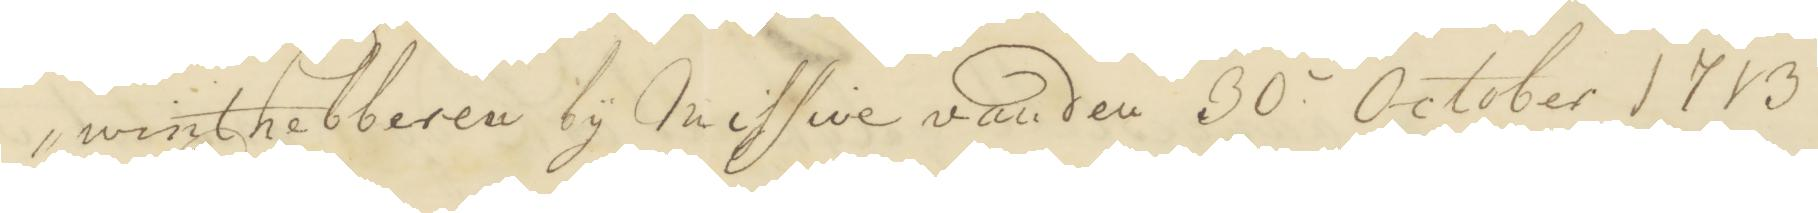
„winthebberen bij missive van den 30.' October 1713
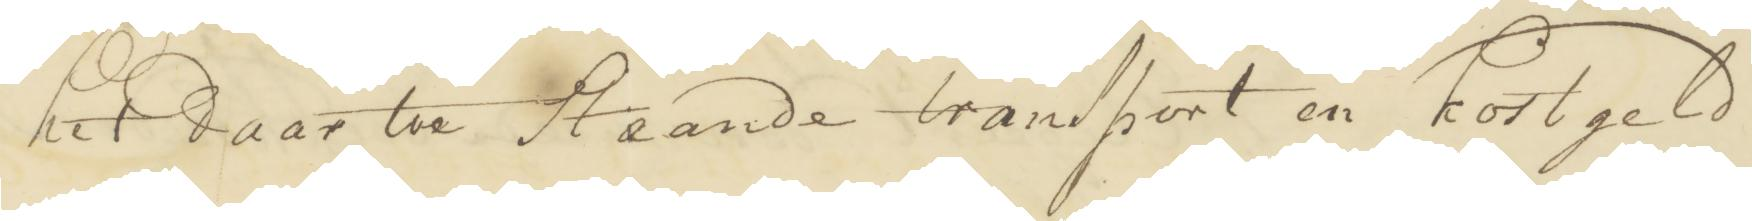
het daar toe staande transport en kostgeld
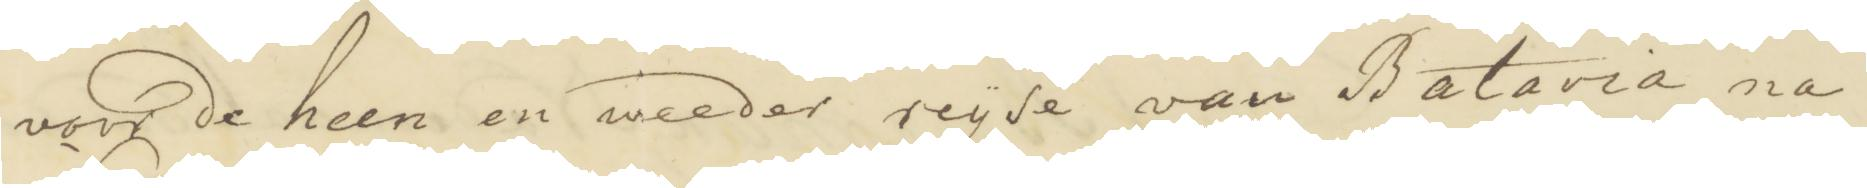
voor de heen en weeder reijse van Batavia na
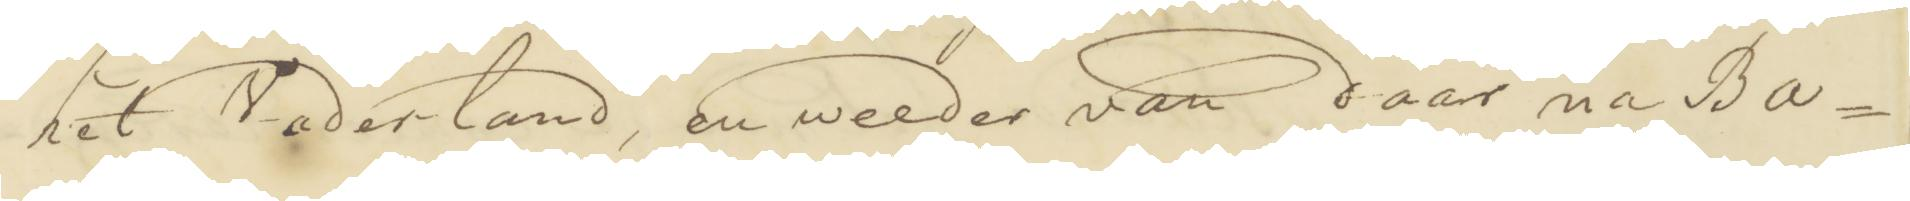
het Vaderland, en weeder van daar na Ba=
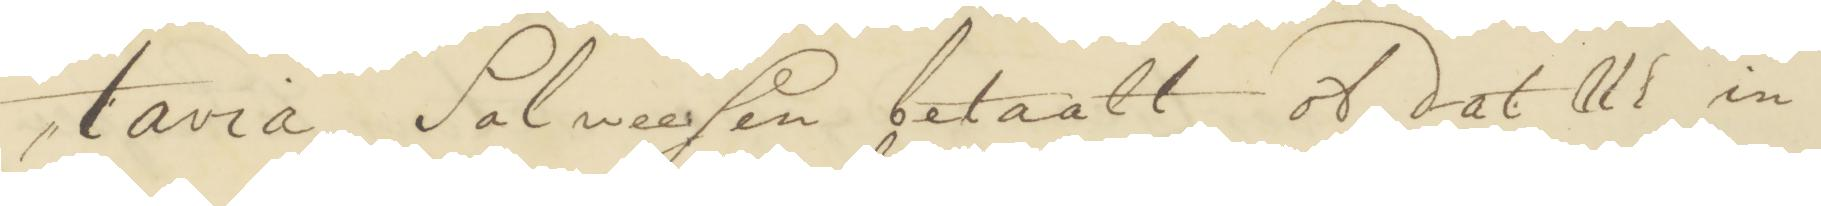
„tavia sal weesen betaalt of dat UE in
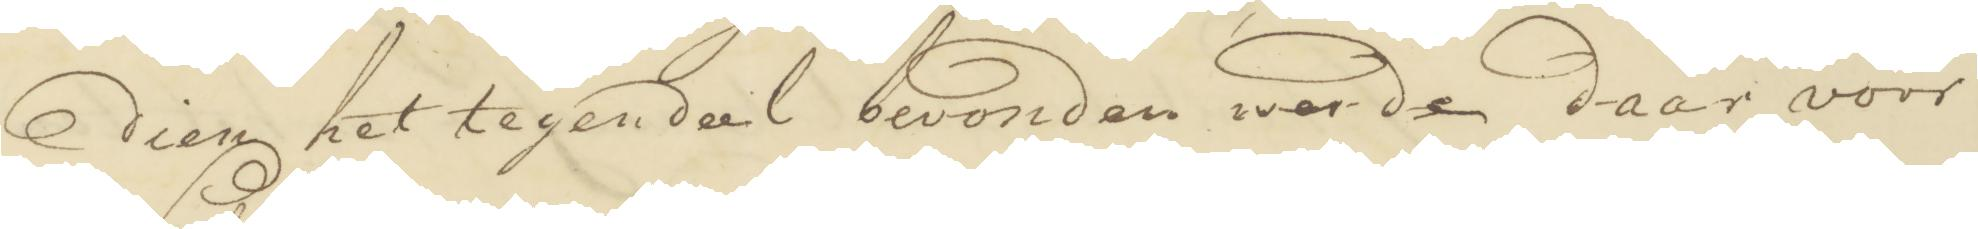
dien het tegen deel bevonden werde daar voor
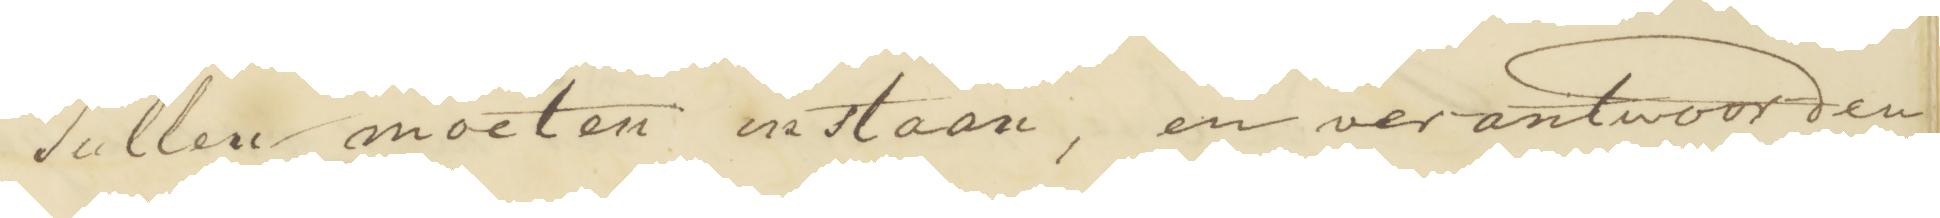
sullen moeten instaan, en verantwoorden
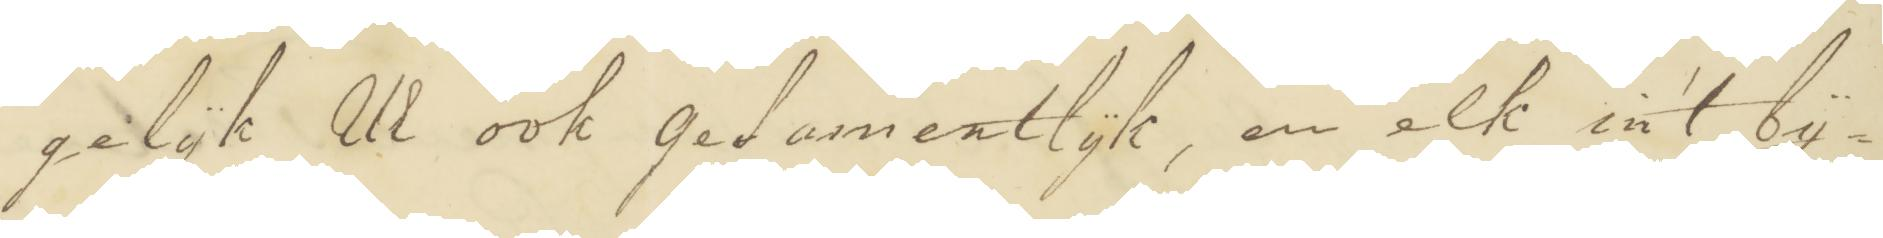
gelijk UE ook gesamentlijk, en elk in 't bij=
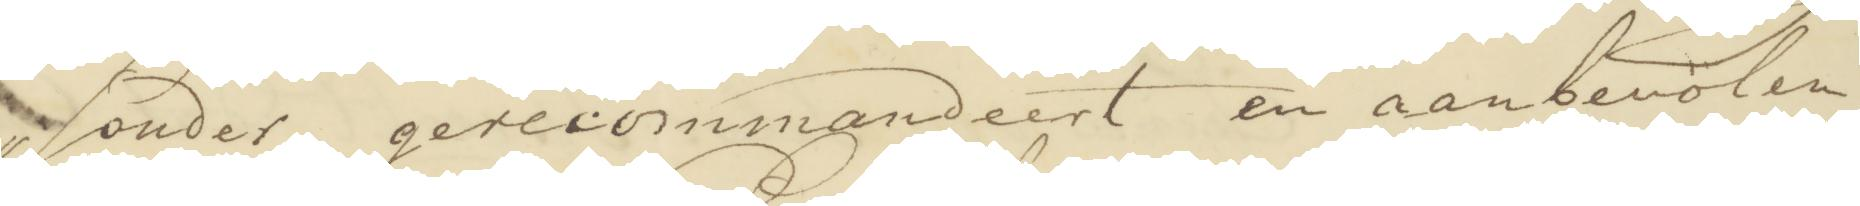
„sonder gerecommandeert en aanbevolen
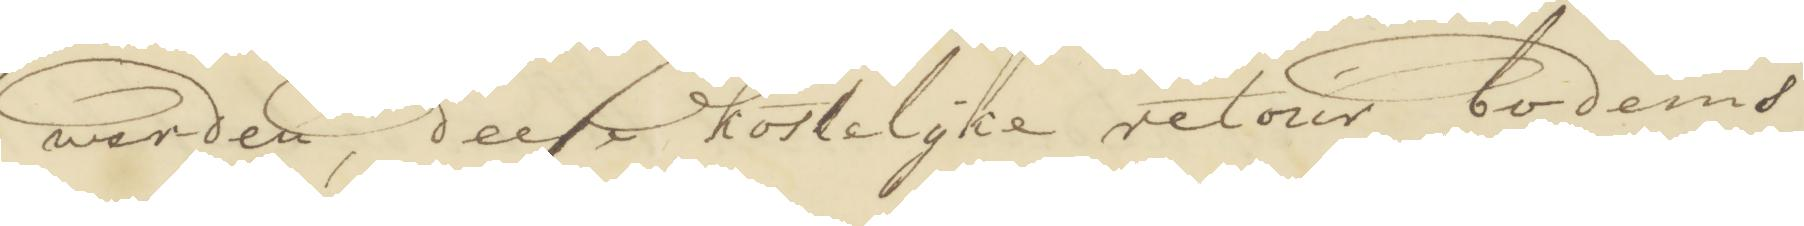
werden, deese kostelijke retour bodems
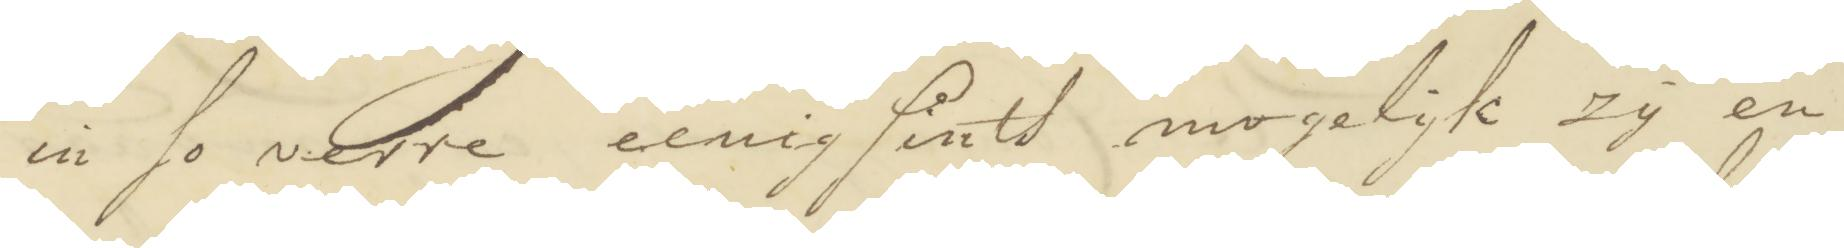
in so verre eenig sints mogelijk zij en
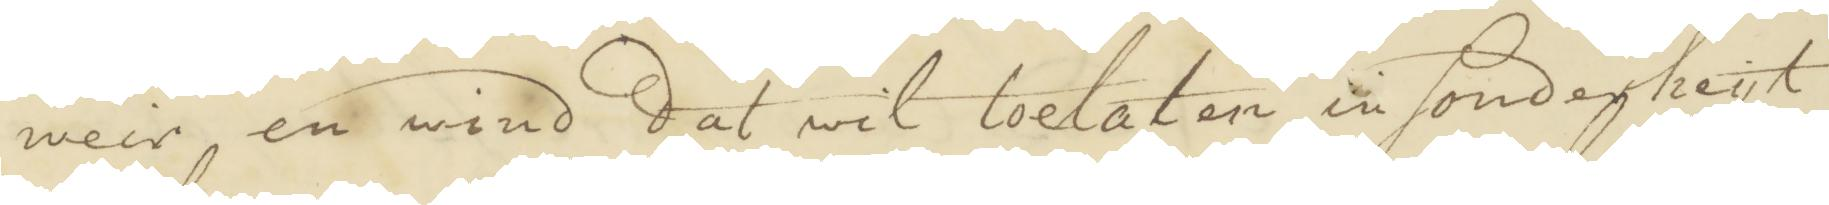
weir en wind dat wil toelaten in sonderheijt
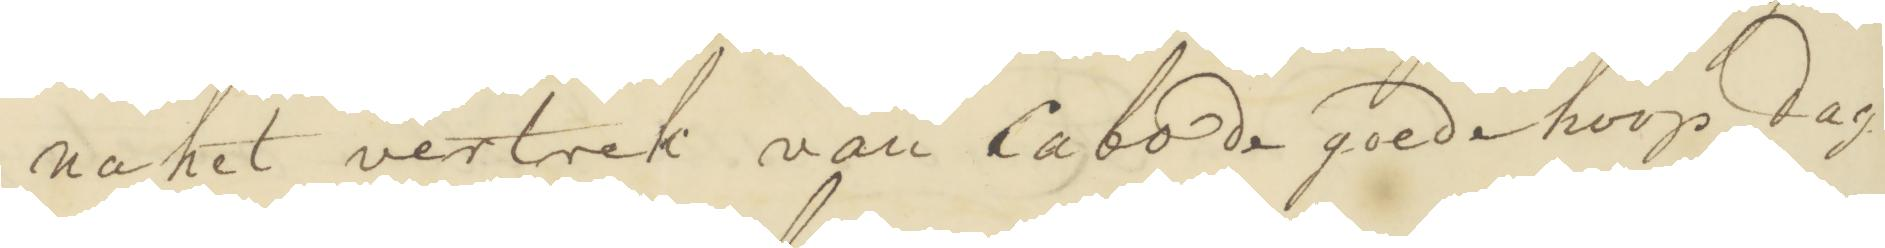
na het vertrek van Cabo de goede hoop dag
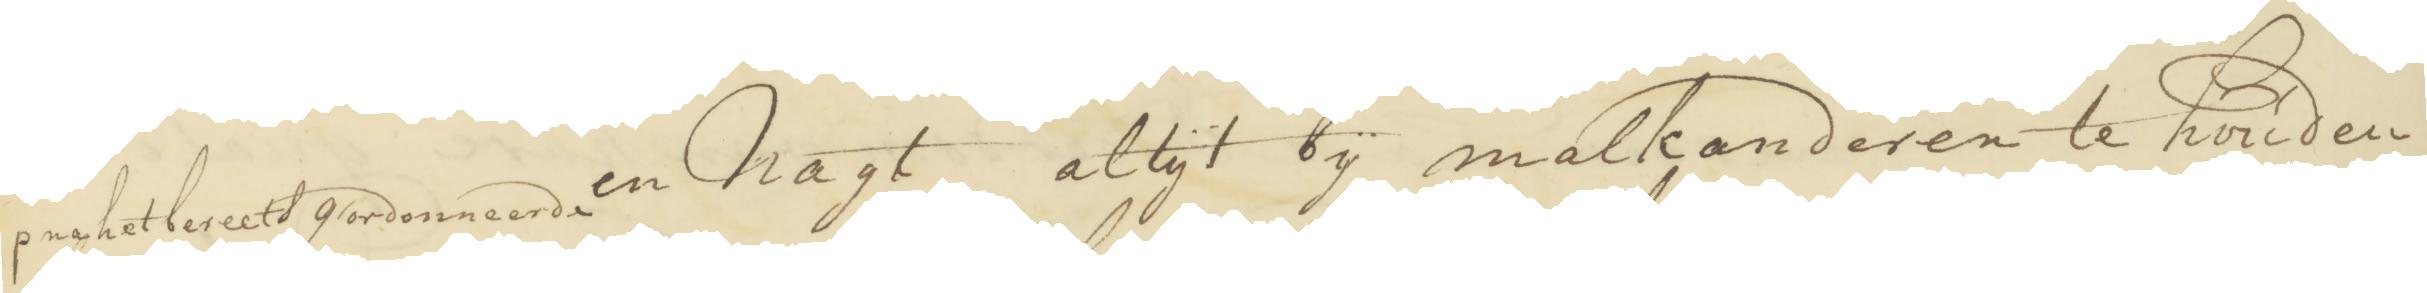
p na het bereets g'ordonneerde en nagt altijt bij malkanderen te houden
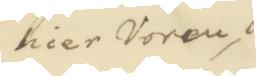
hier voren
